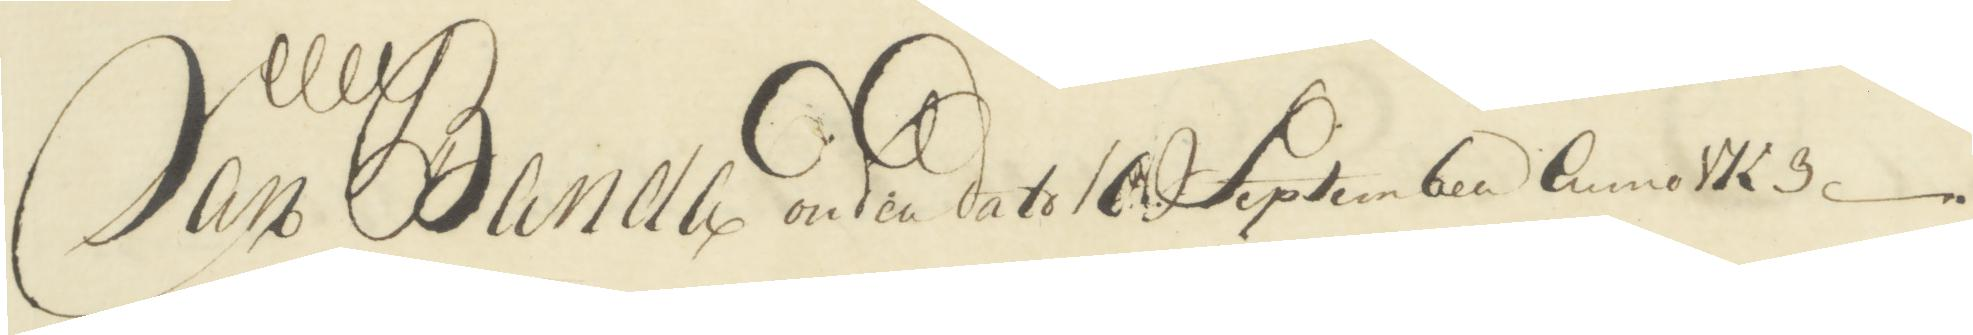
Van Banda onder dato 10.. September Anno 1743
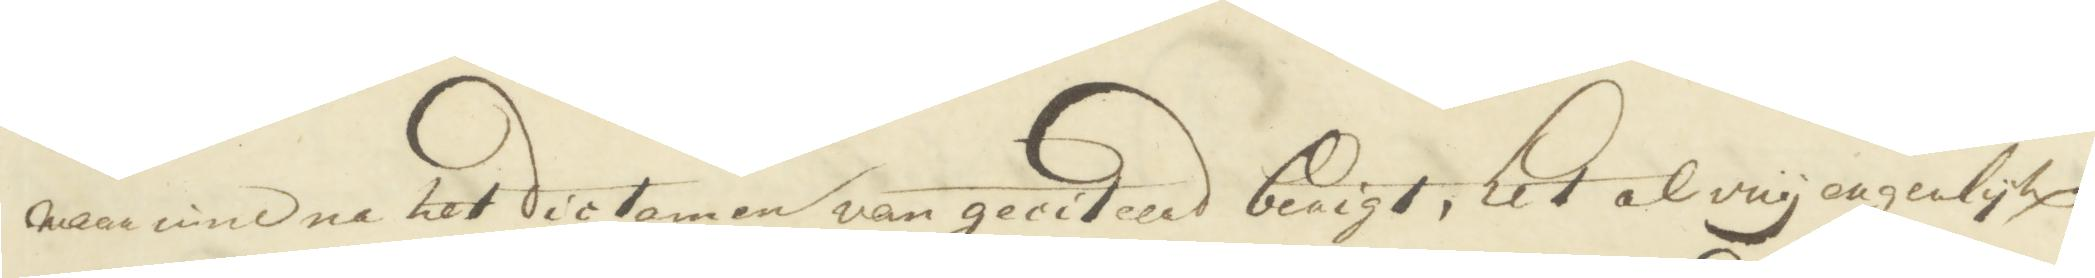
waarinne na het dictamen van geciteerd berigt, het al vrij ergerlijk
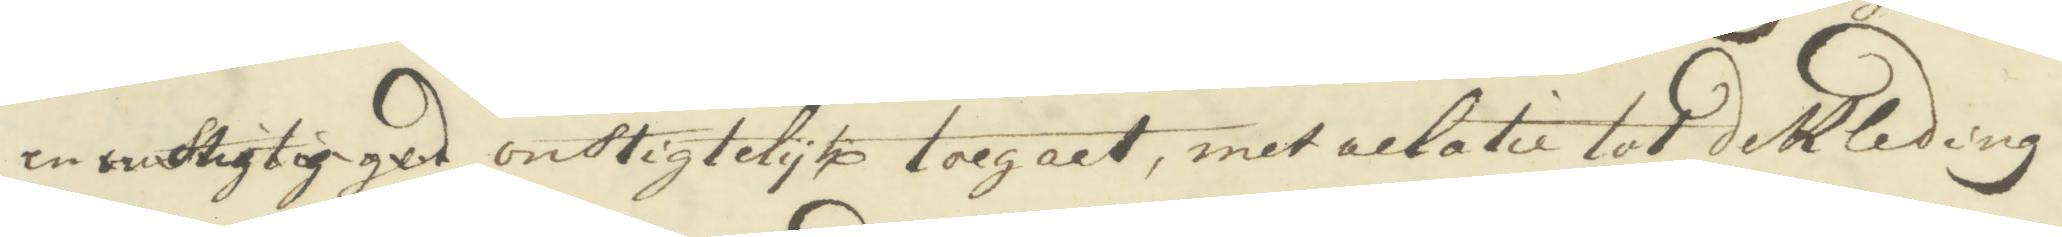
en onstigtig ged onstigtelijk toegaet, met relatie tot de kleding
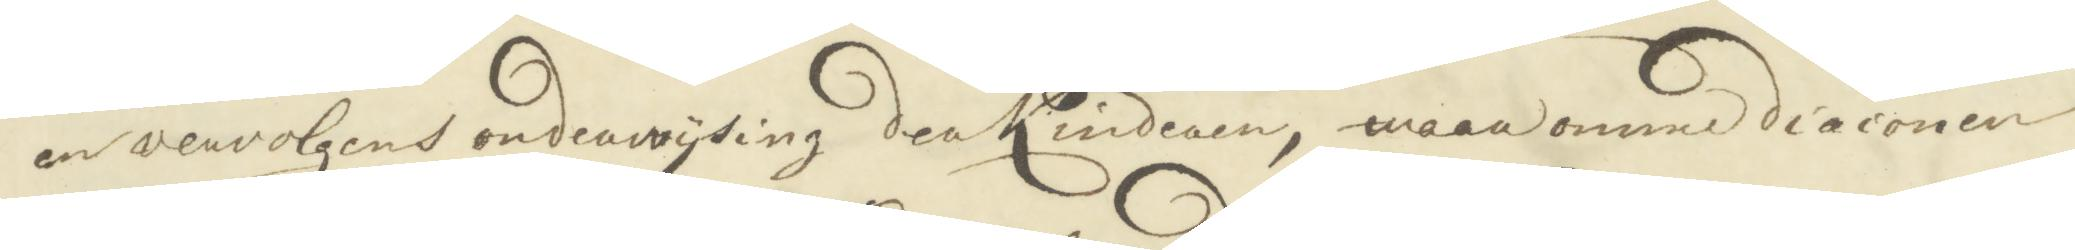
en vervolgens onderwijsing der kinderen, waar omme diaconen
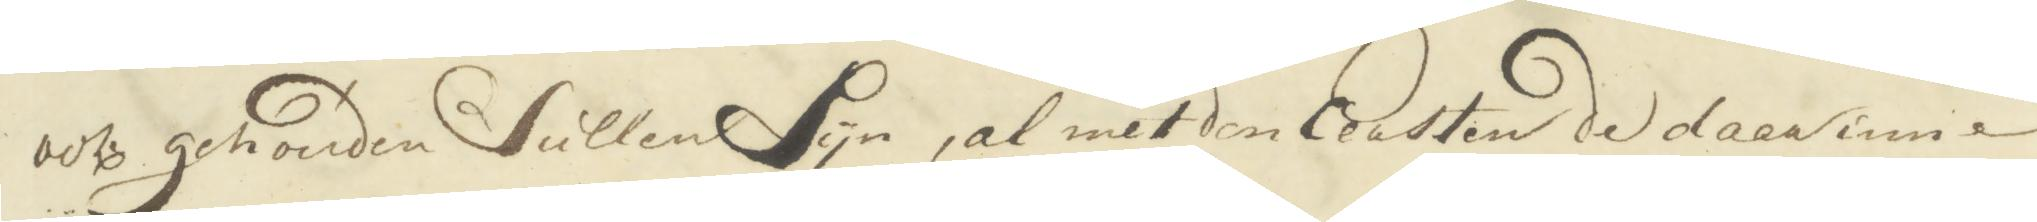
ook gehouden sullen sijn, al met den Eersten de daar inne
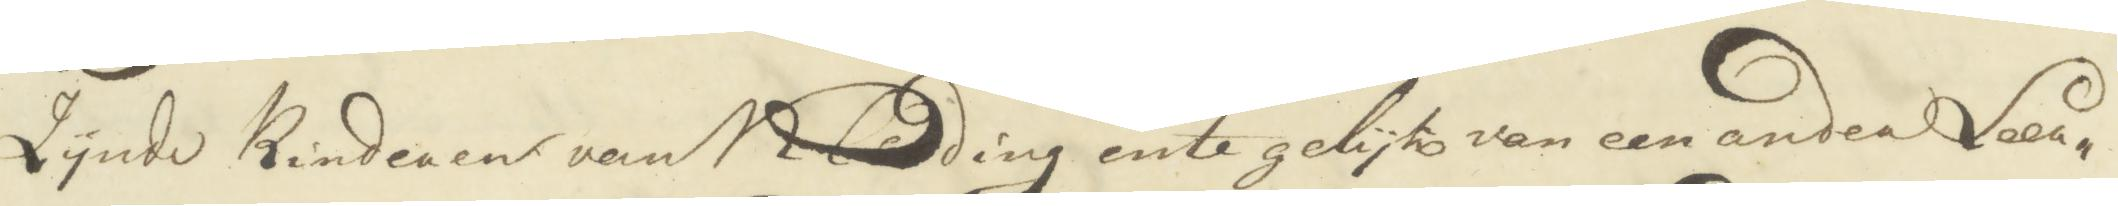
zijnde Kinderen van Kleding ente gelijk van een ander Leer„
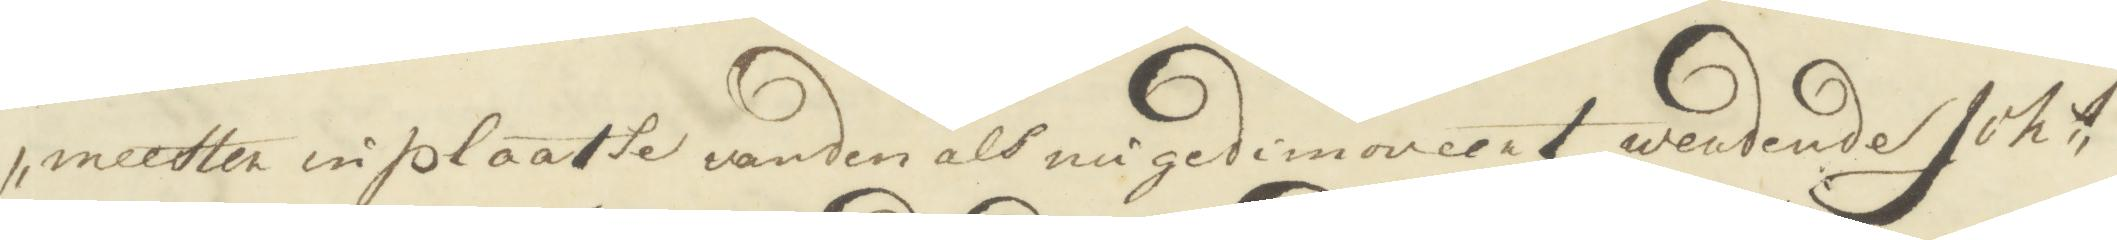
„meester in plaatse van den als nu gedimoveert werdende Joh„s
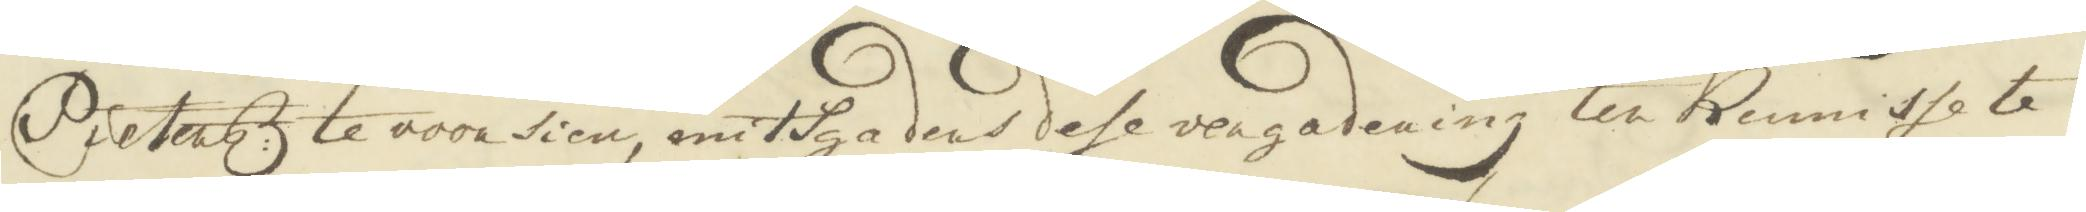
Pieters: te voorsien, mitsgaders dese vergadering ter kennisse te
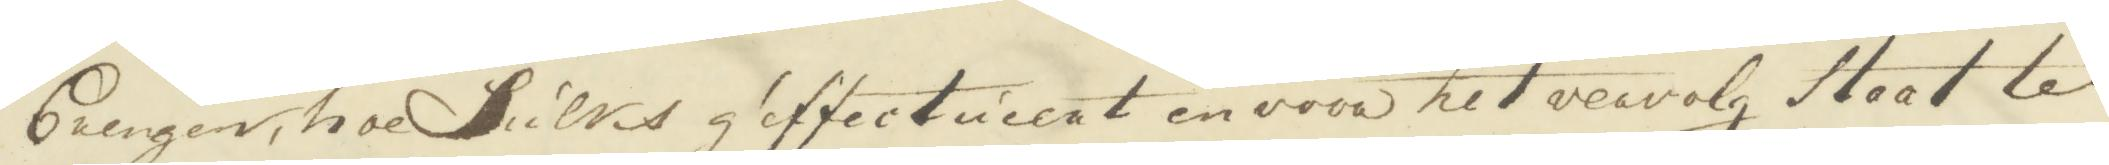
brengen, hoe sulks g’effectueert en voor het vervolg staat te
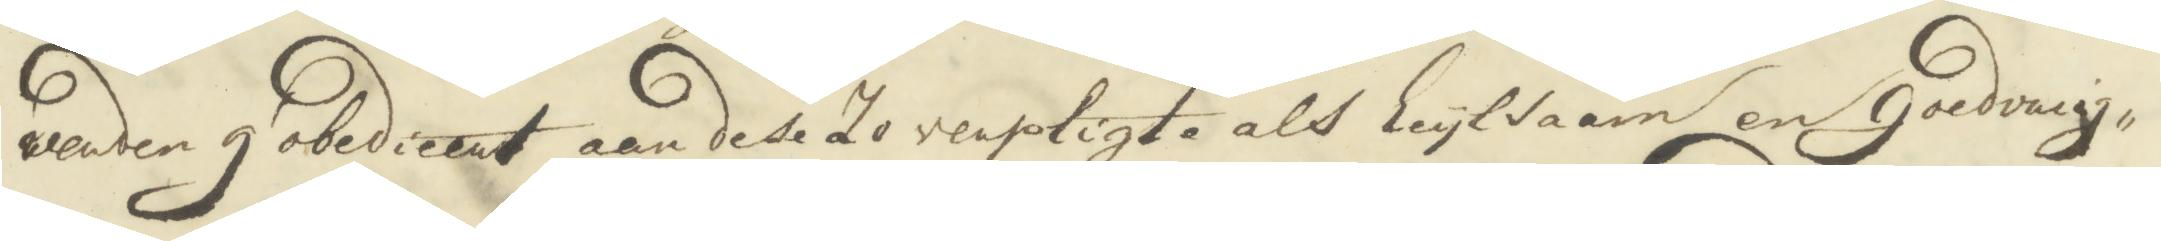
werden g’obedieert aan dese zo verpligte als heijlsaam en goedvrug„
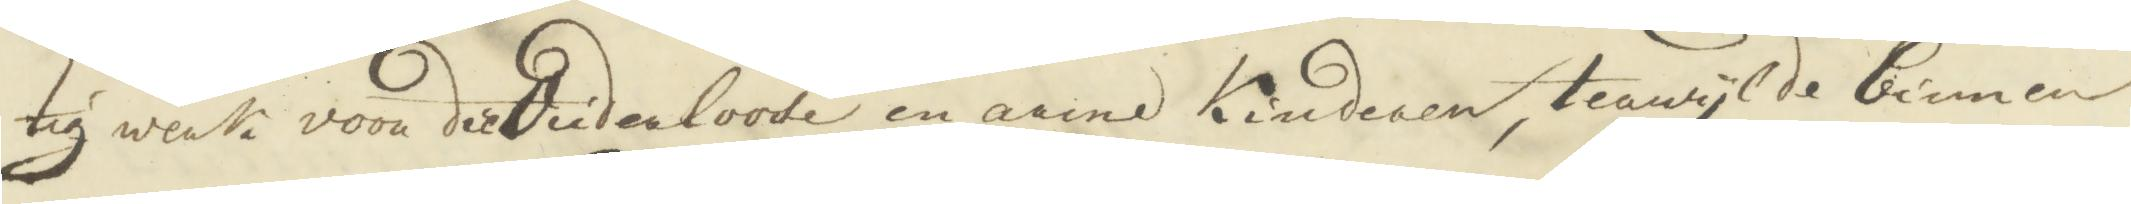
tig werk voor den Ouderloose en arme kinderen, terwijl de binnen
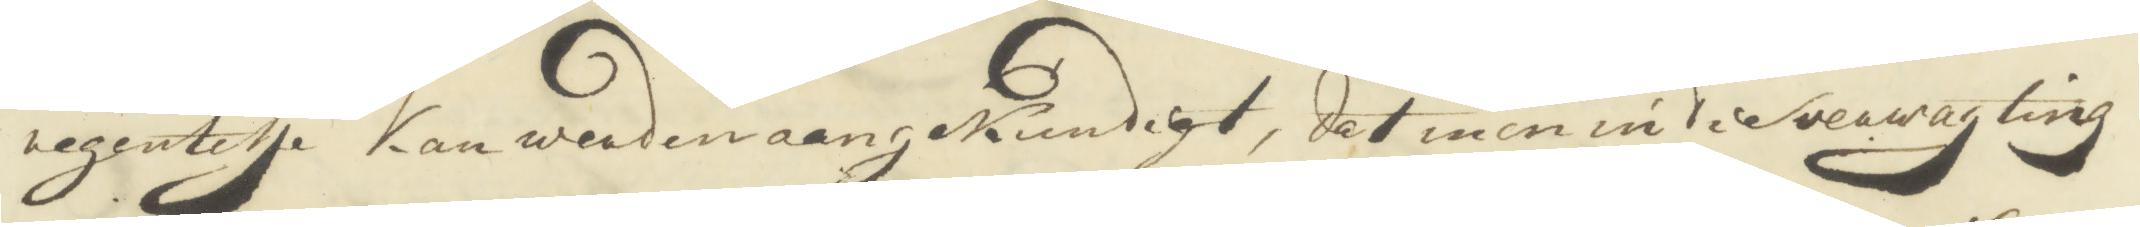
regentesse kan werden aangekundigt, dat men in die verwagting
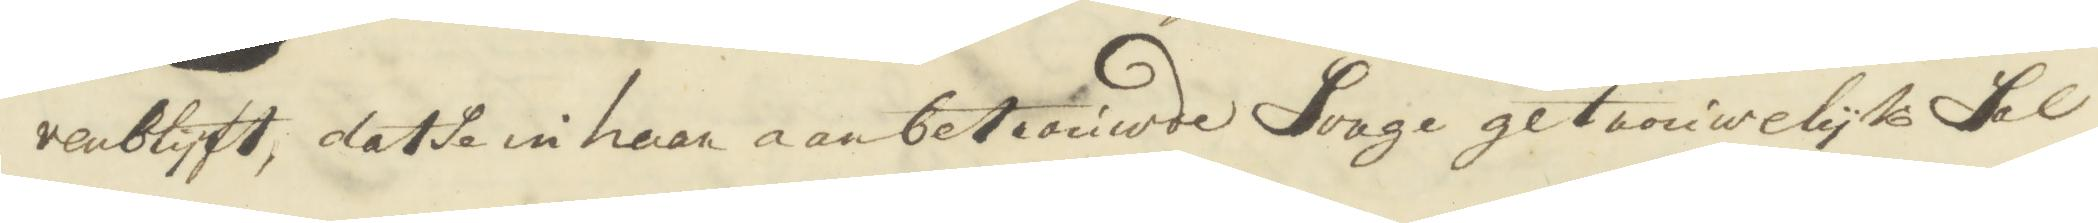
verblijft, datse in haar aanbetrouwde Sorge getrouwelijk sal
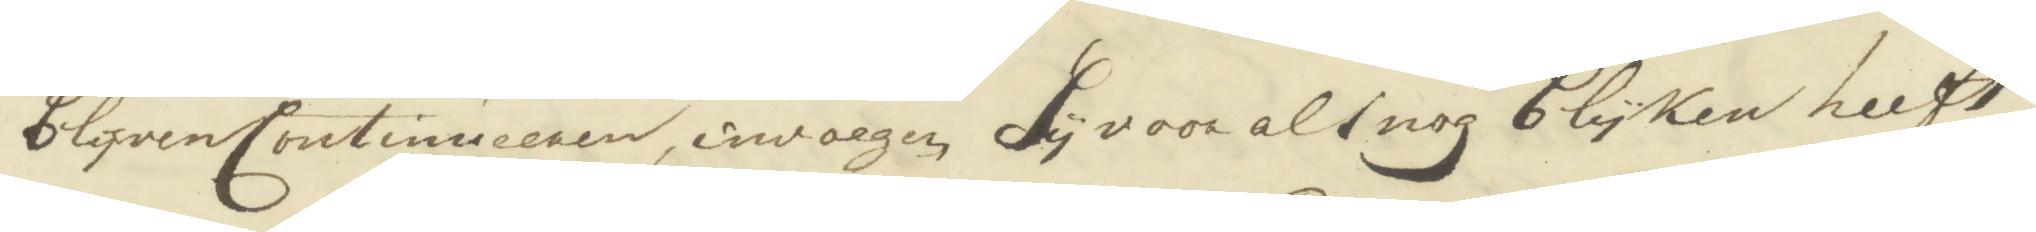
blijven Continueeren, invoegen sij voor als nog blijken heeft
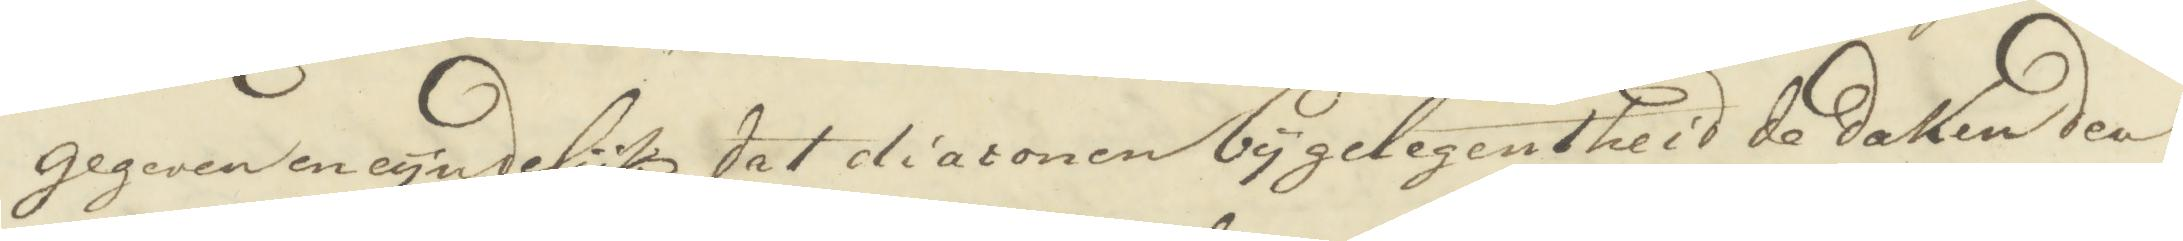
gegeven en eijndelijk dat diaconen bij gelegentheid de daken der
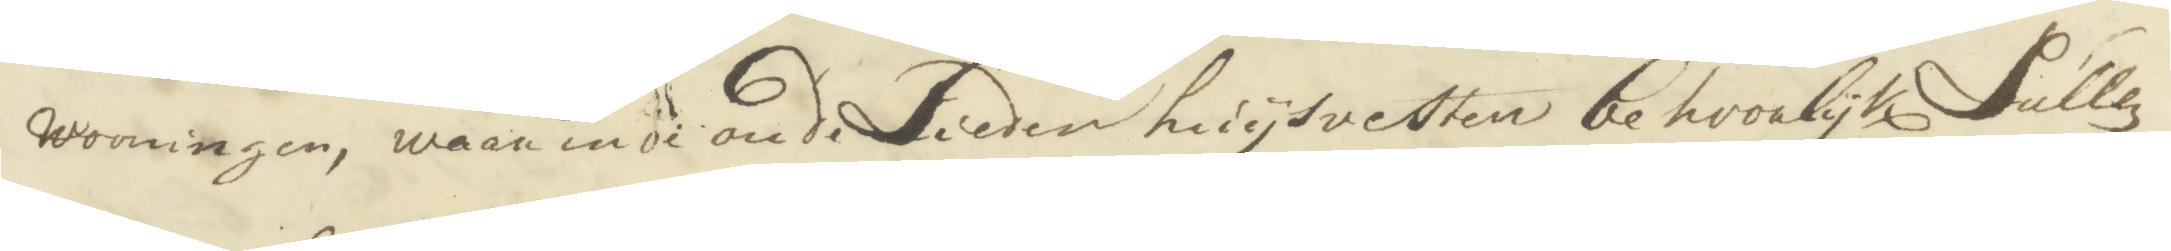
wooningen, waar in de oude Lieden huijsvesten behoorlijk sullen
